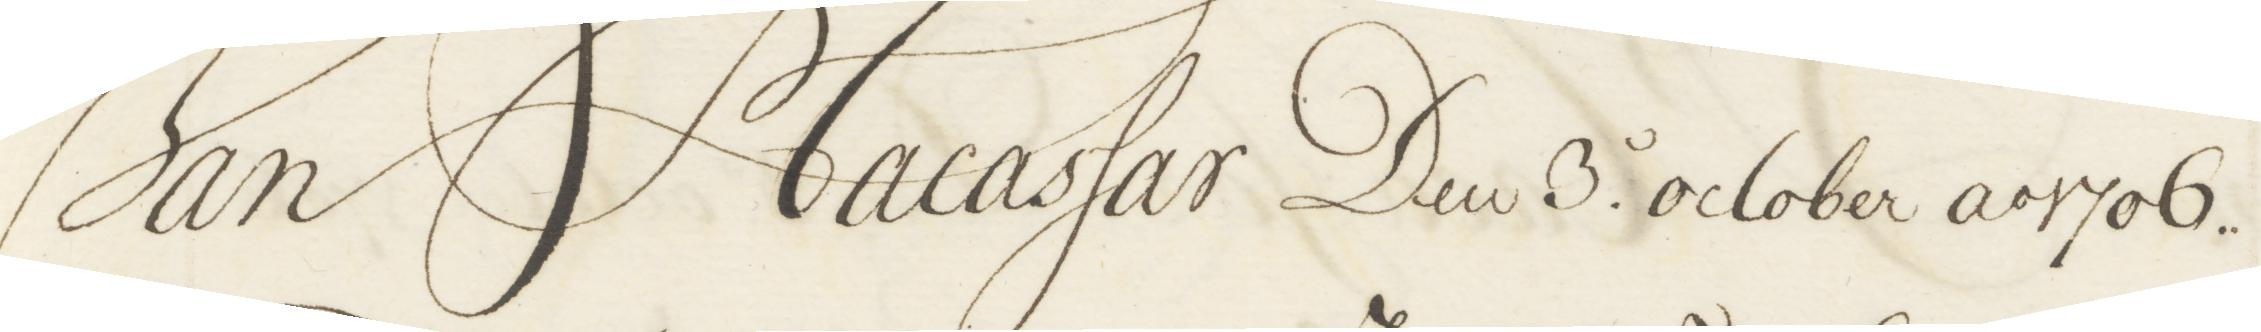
Van Macassar Den 3:' october ao 1706..
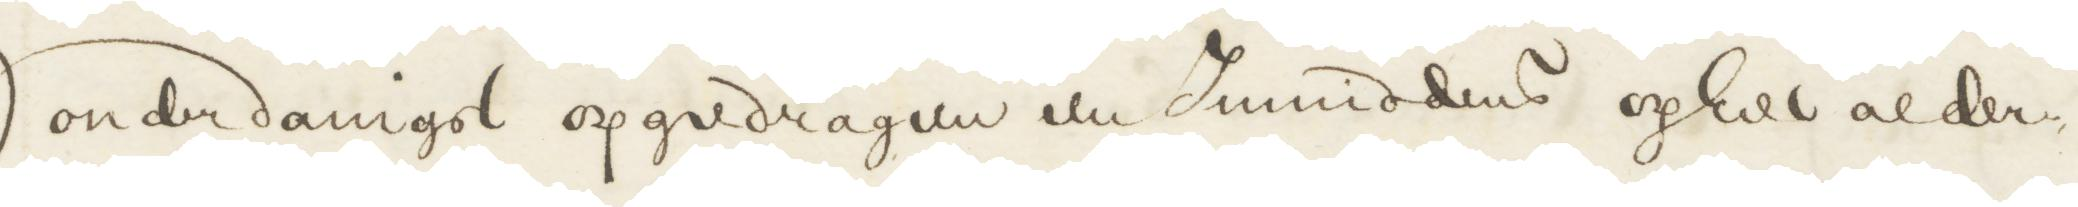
onderdanigst op gedragen en Inmiddens op het alder„
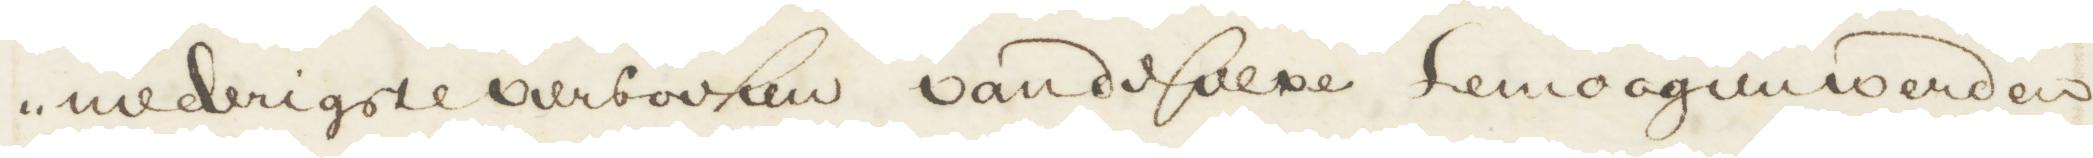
„nederigste versoeken van deselve temoogen werden
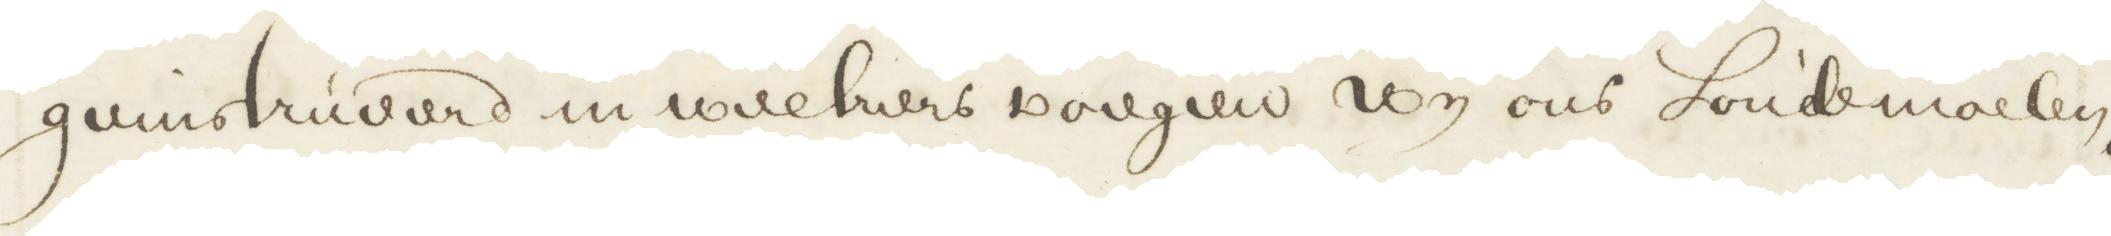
geinstrueerd in welkers voegen wij ons soude moeten
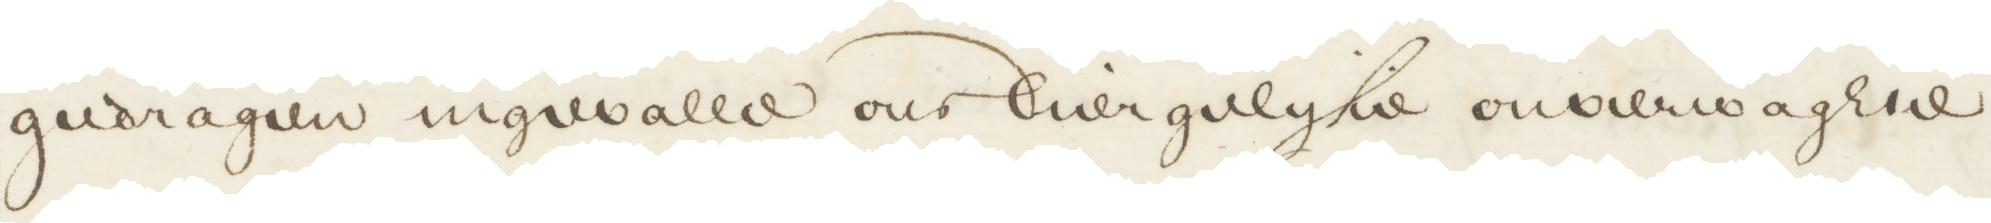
gedragen ingevalle ons dier gelijke onverwaghte
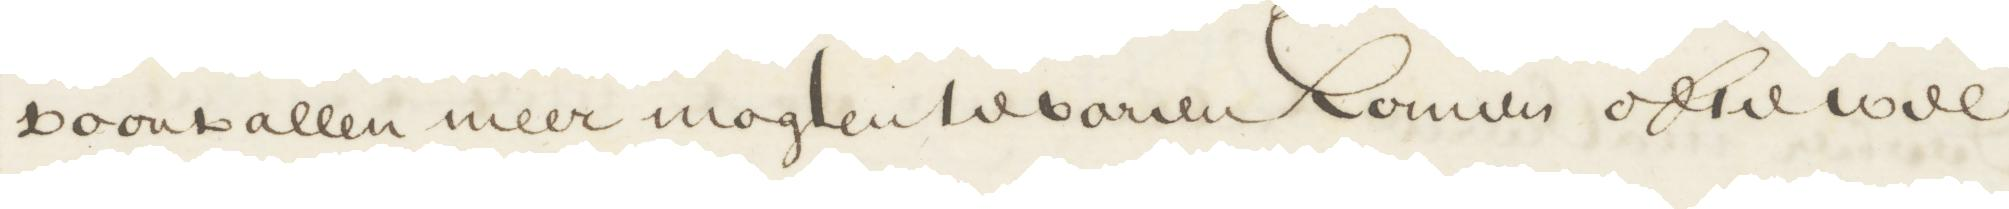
voort allen meer mogten te voren komen ofte wel
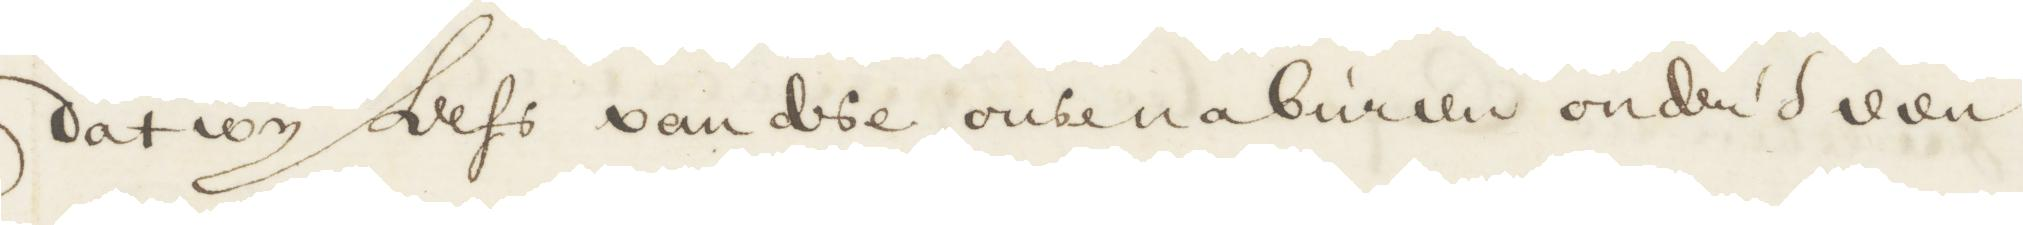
dat wij selfs van dese onse na buren onder 't een
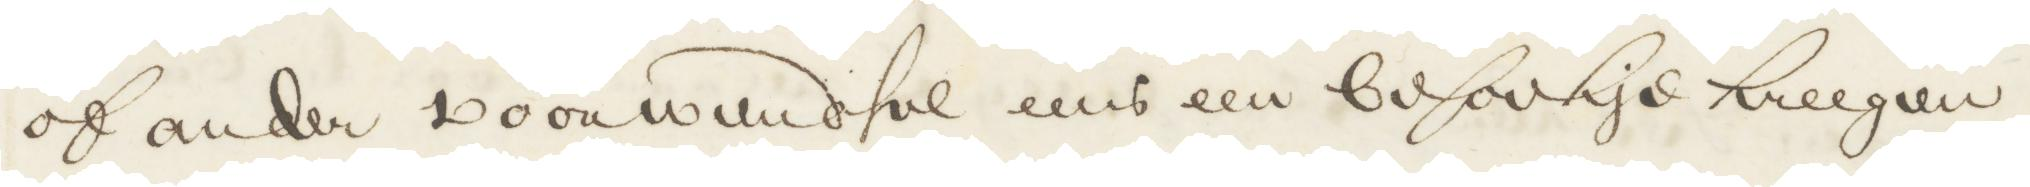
of ander voorwendsel eens een besoekje kreegen
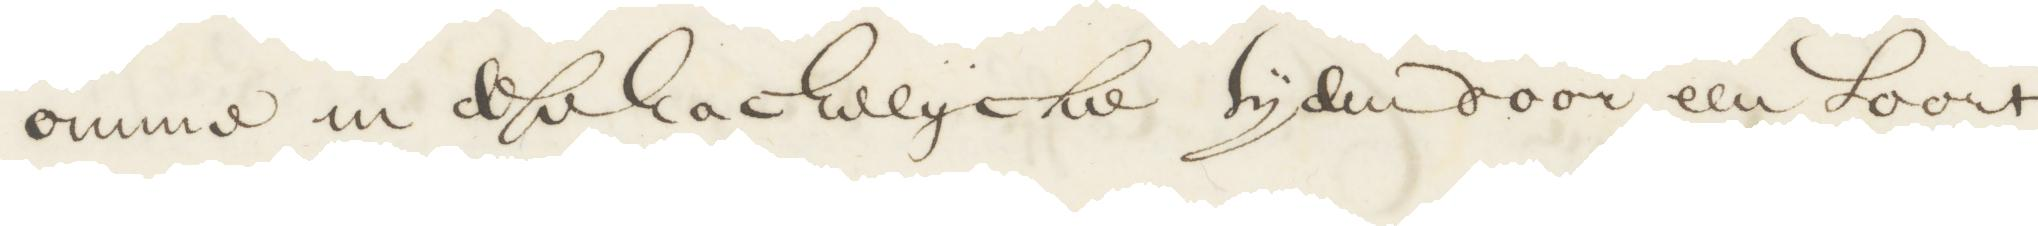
omme in dese hachelijcke tijden door een soort
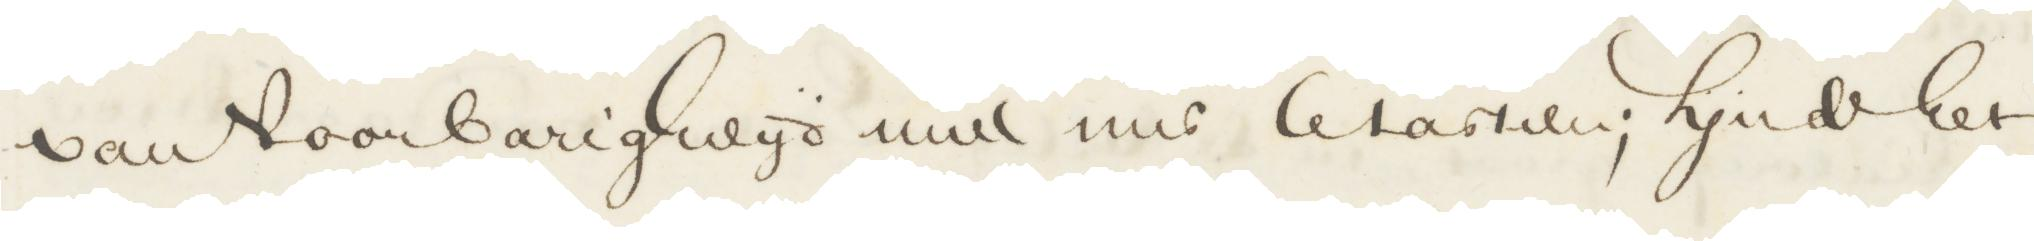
van voorbarigheijd niet mis te tasten; sijnde het
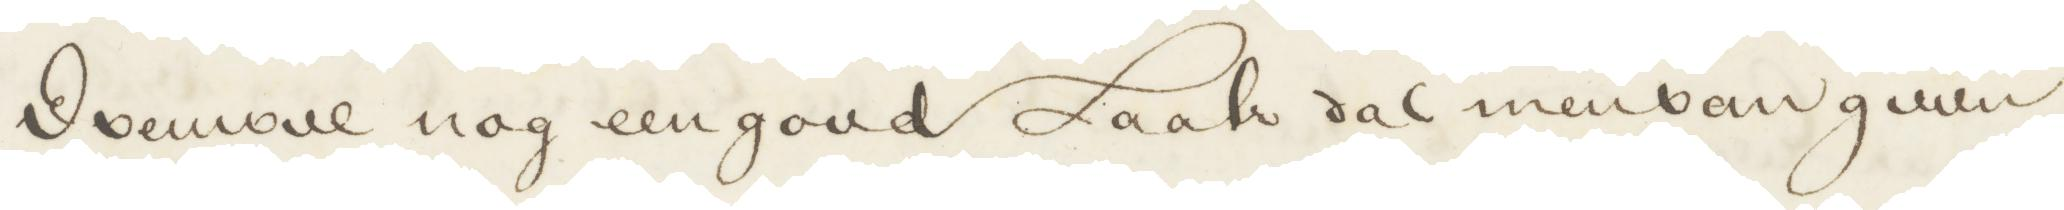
Evenwel nog een goed zaak dat men van geen
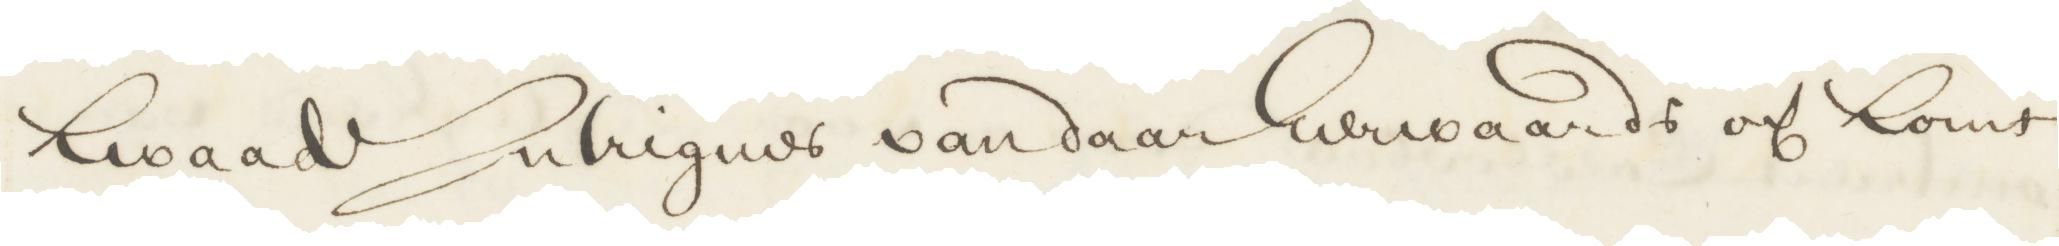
kwaade Jntrigues van daar herwaards op komt
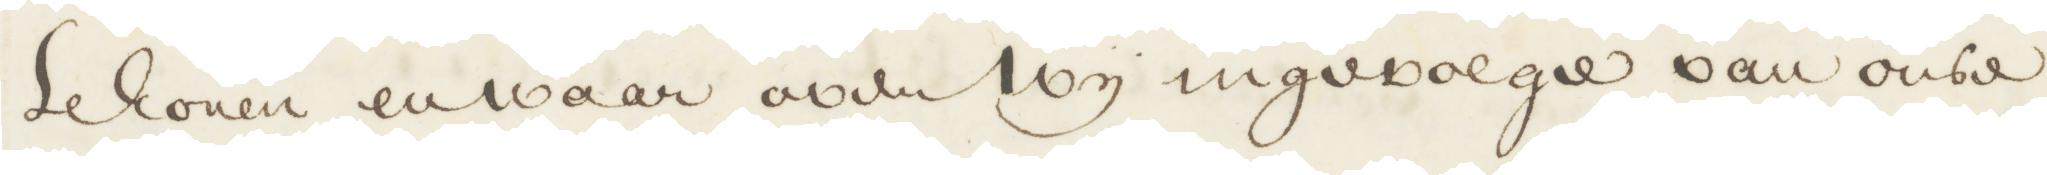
tehoren en waar over wij ingevolge van onse
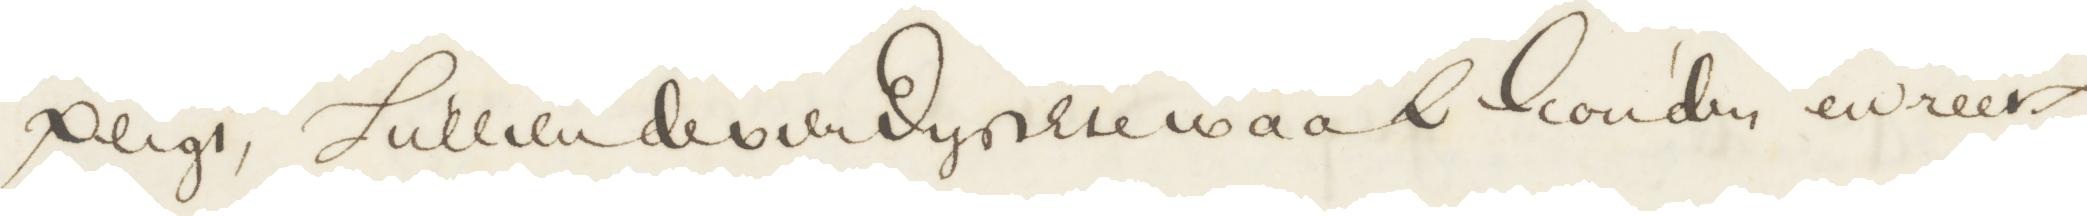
pligt, sullen de verEyschte waak houden en reets
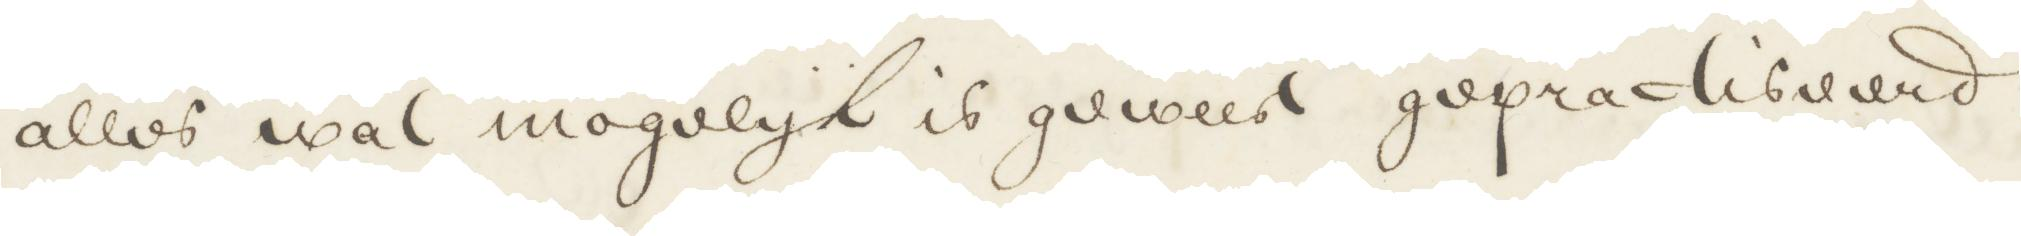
alles wat mogelijk is geweest gepractiseerd
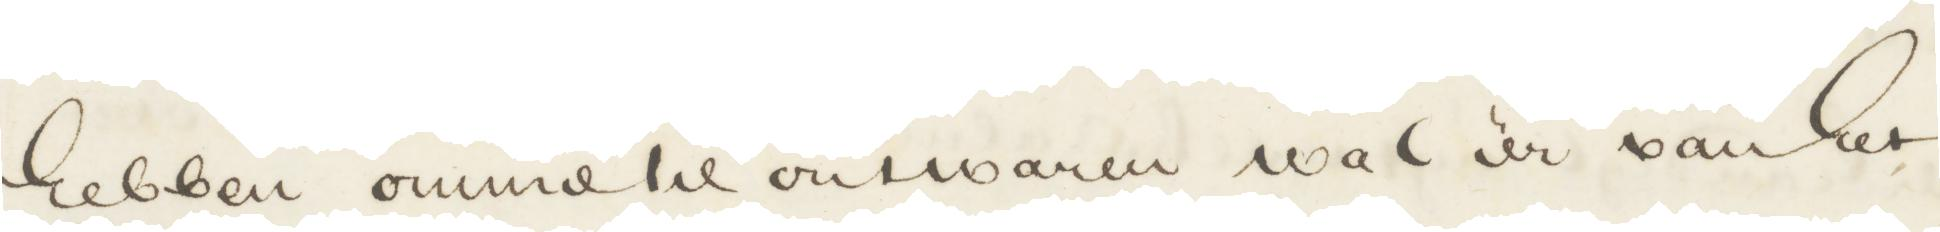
hebben omme te ontwaren wat 'er van het
